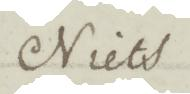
Niets
